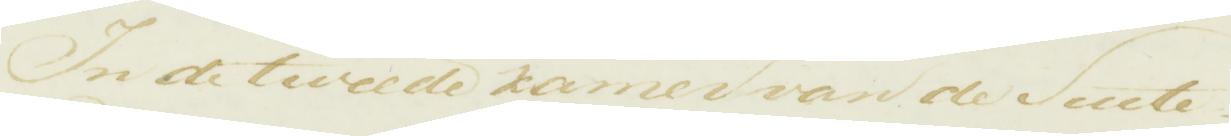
In de tweede kamer van de Suite
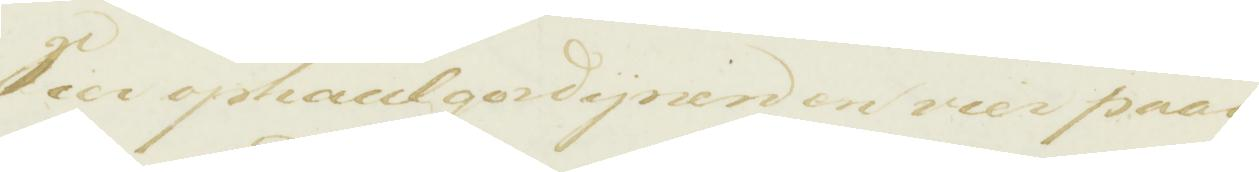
Vier ophaalgordijnen en vier paar
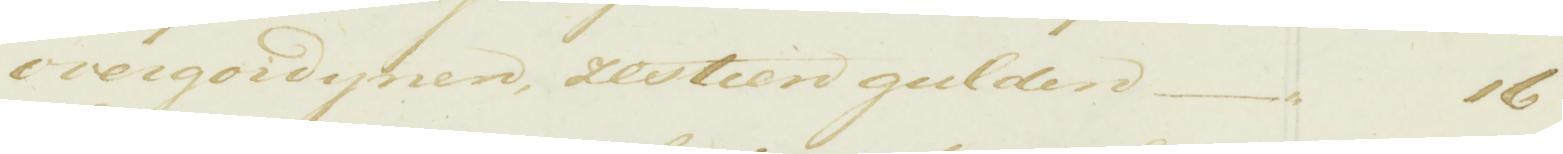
overgordynen, zestien gulden— „ 16
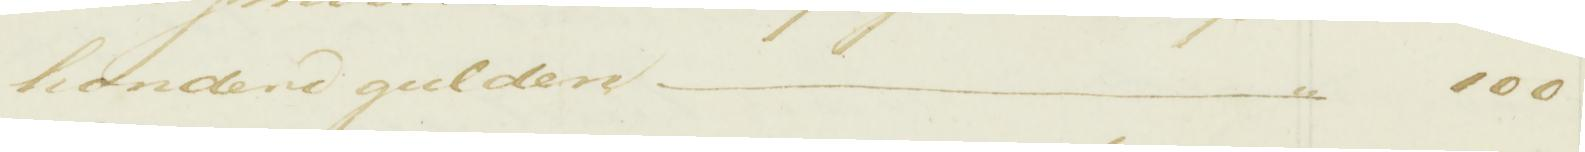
honderd gulden——————— „ 100
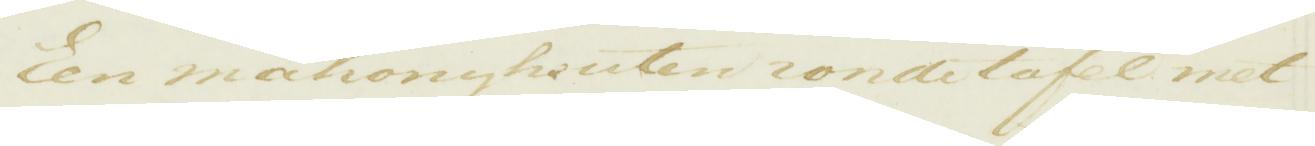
Een mahonyhouten ronde tafel met
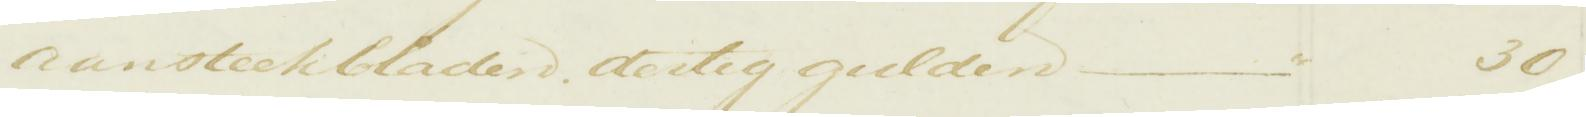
aansteekbladen, dertig gulden — „ 30
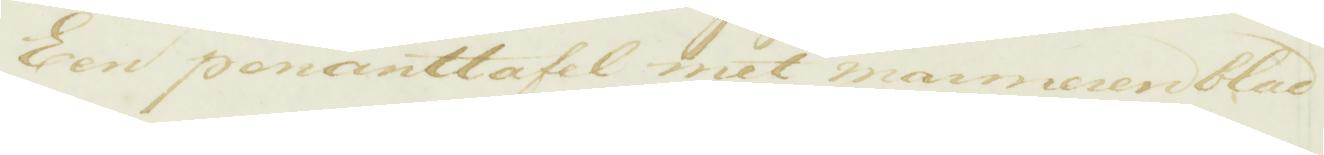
Een penanttafel met marmeren blad
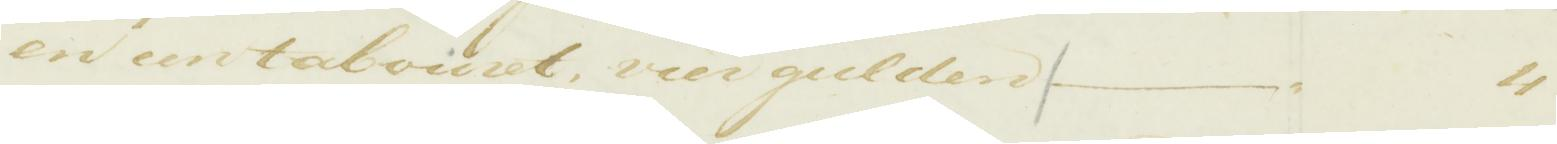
en een tabouret, vier gulden /—— „ 4
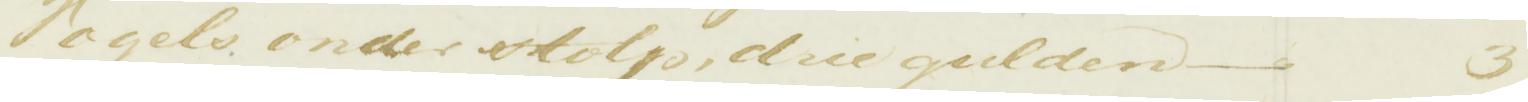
Vogels, onder stolp, drie gulden — „ 3
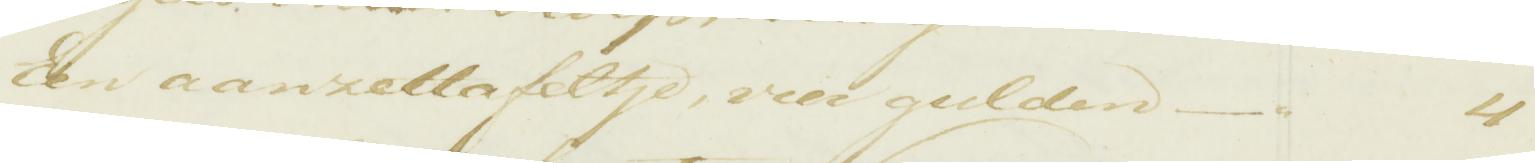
Een aanzettafeltje, vier gulden — —„ 4
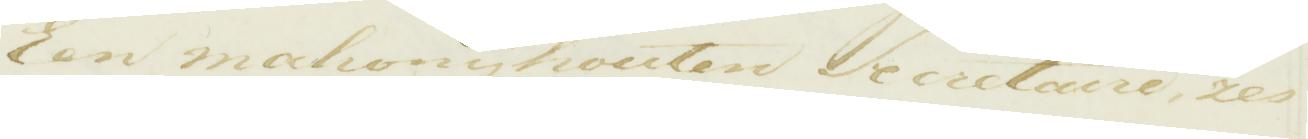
Een mahonyhouten Secretaire, zes
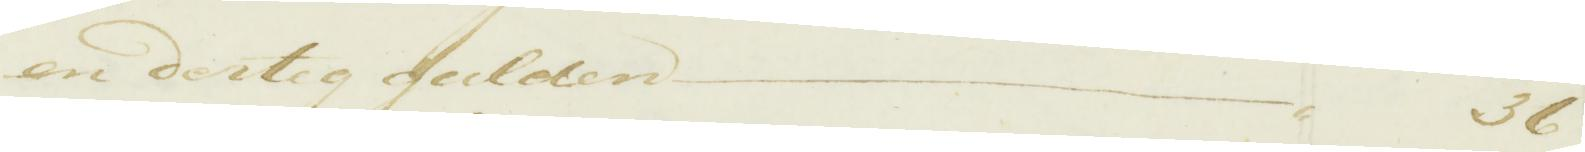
en dertig gulden ——————— „ 36
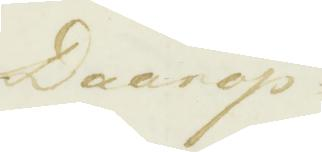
Daarop.
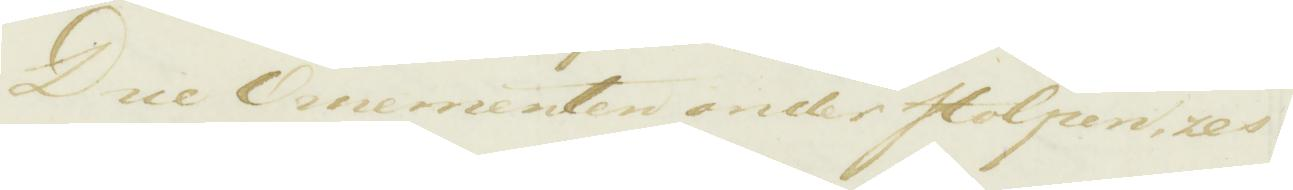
Drie Ornementen onder stolpen, zes
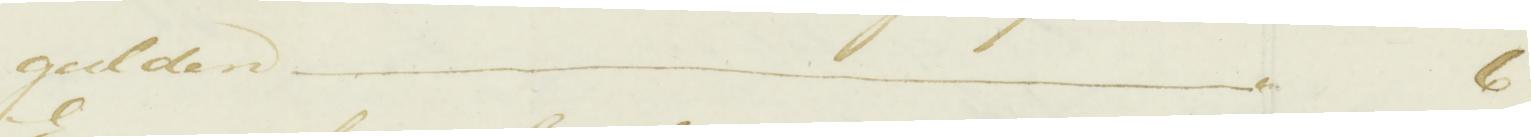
gulden————————————— „ 6
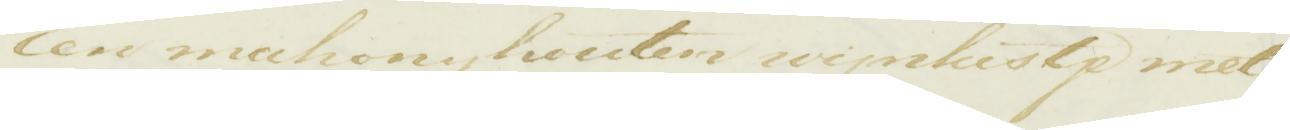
Een mahonyhouten wijnkistje met
